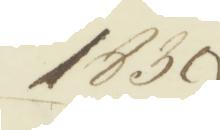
1839
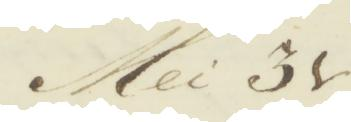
Mei 31
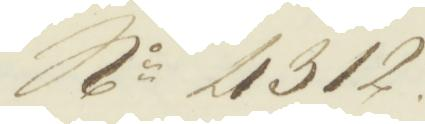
N=o 4312
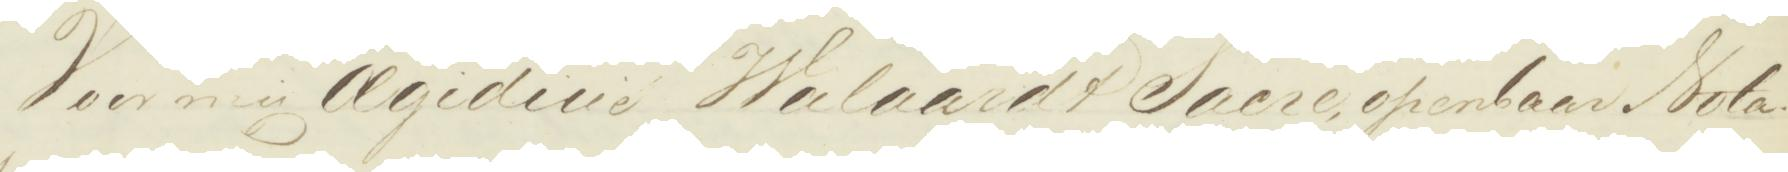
Voor mij AEgidius Walaardt Sacré, openbaar Nota
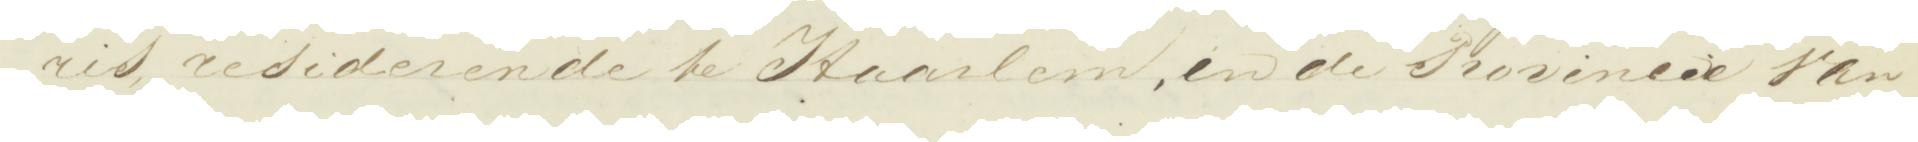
ris, residerende te Haarlem, in de Provincie van
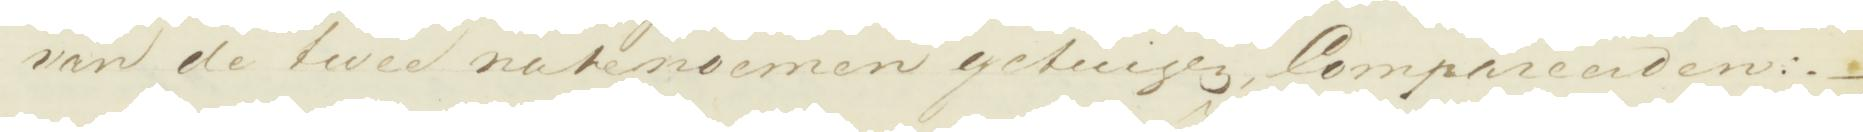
van de twee natenoemen getuigen, Compareerden: -
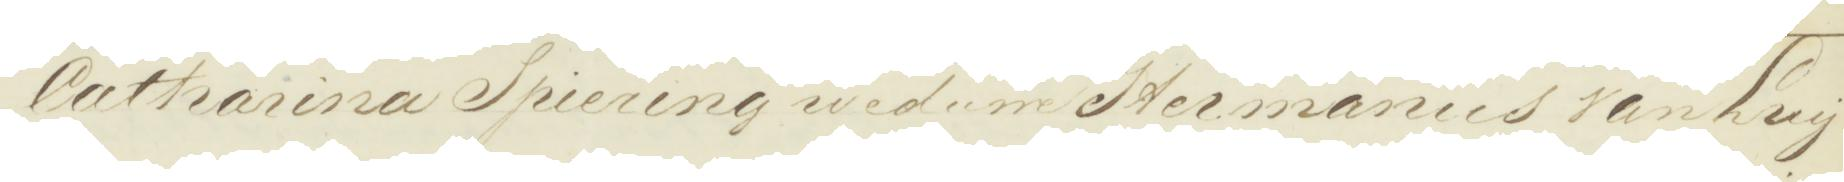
Catharina Spiering weduwe Hermanus van Luij
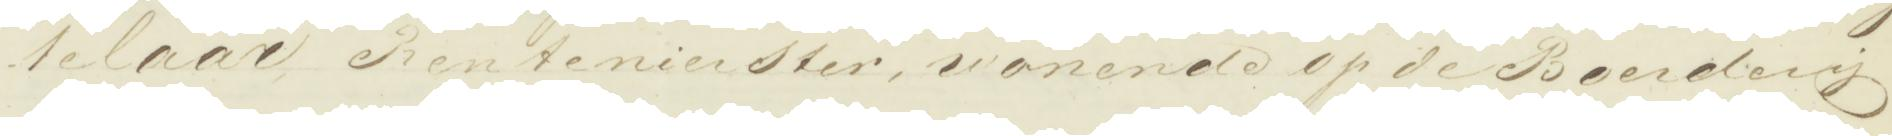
telaar Rentenierster, wonende op de Boerderij
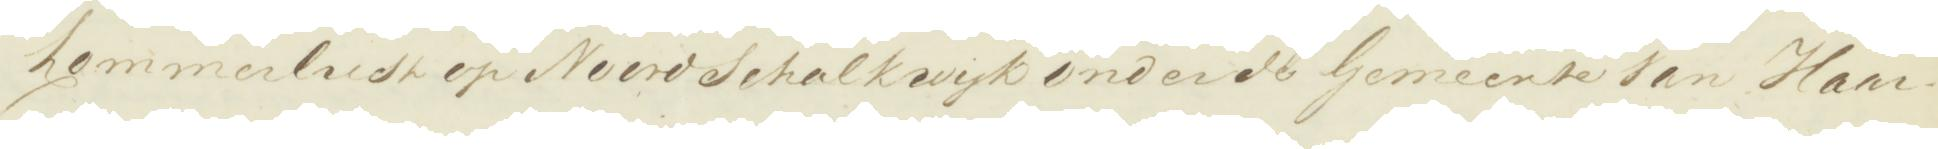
Lommerlust op Noordschalkwijk onderde Gemeente van Haar-
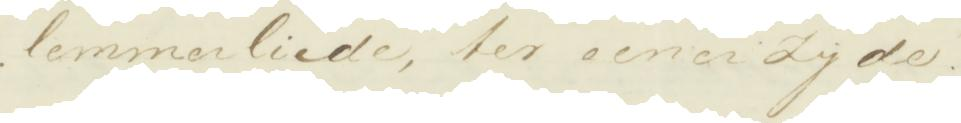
lemmerliede, ter eener zijde
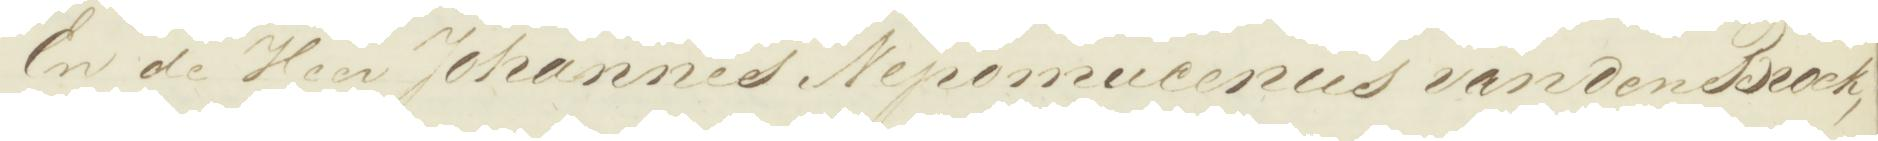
En de Heer Johannes Nepomucenus van den Broek,
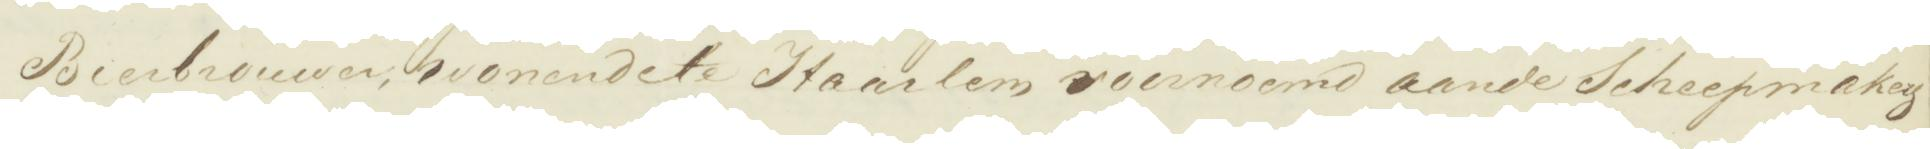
Bierbrouwer, wonende te Haarlem voernoemd aande scheepmakers
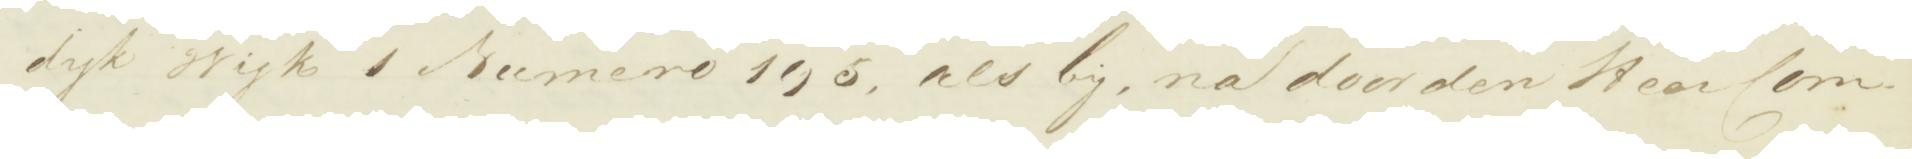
dijk wijk 1 Numero 195, als bij, na door den Heer Com
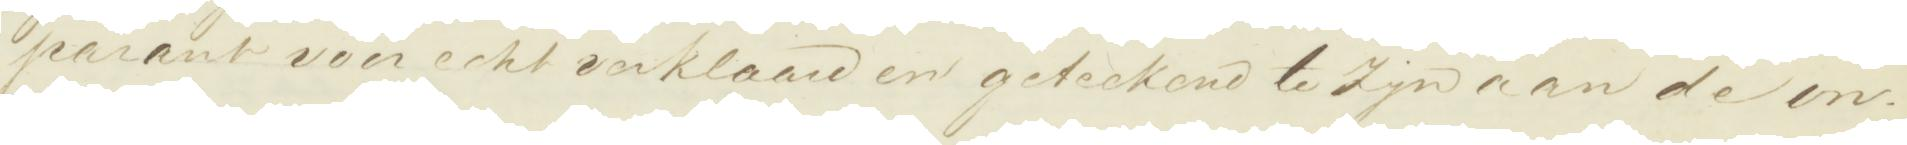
parant voor echt verklaard en geteekend te zijn aan de on-
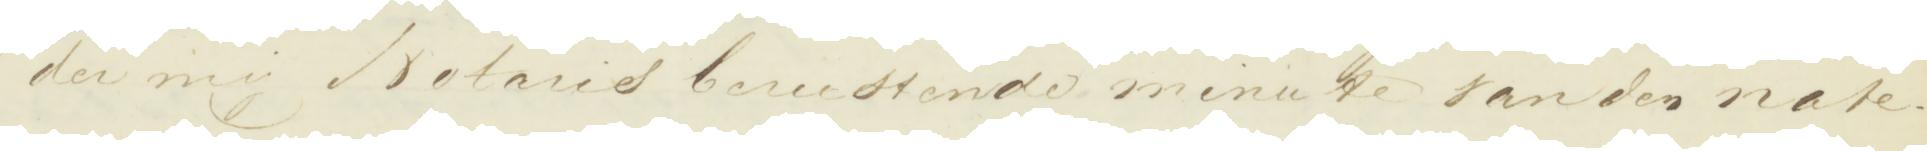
der mij Notaris berustende minute van den nate
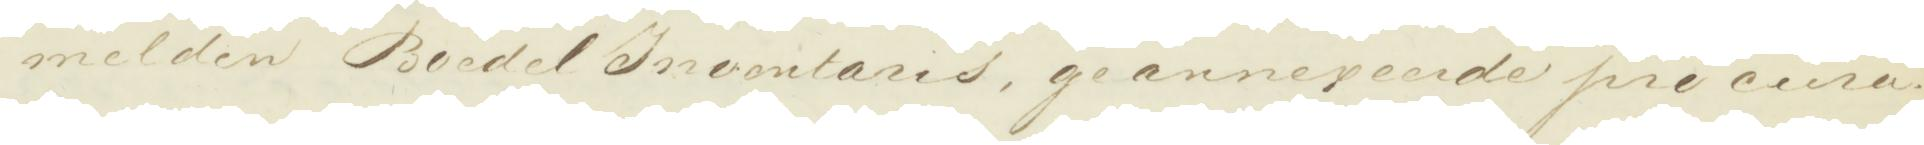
melden Boedel Inventaris, geannexeerde procura
